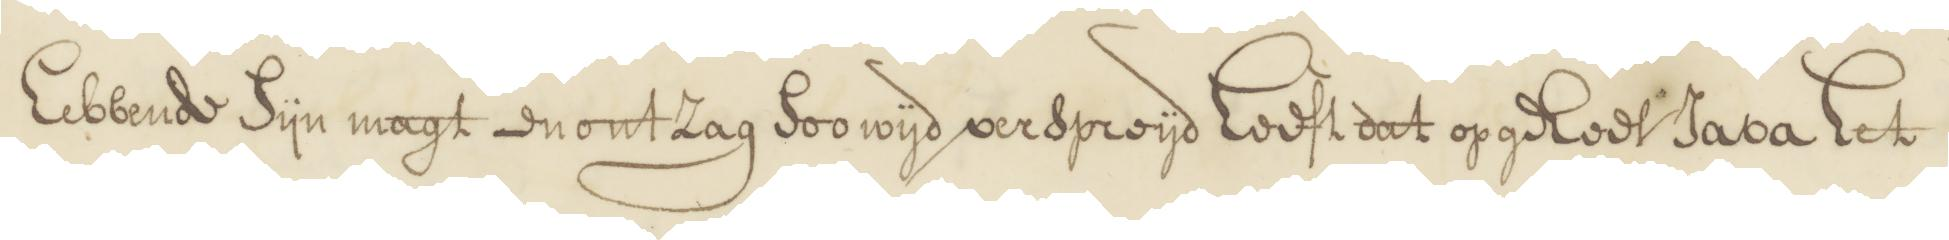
hebbende sijn magt en ontzag soo wijd verspreijd heeft dat op geheel Iava het
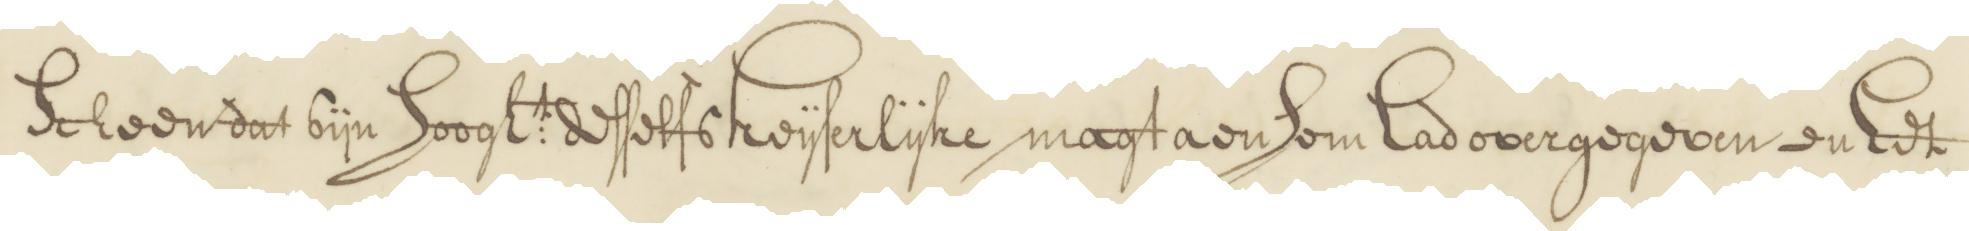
scheen dat sijn hoogh:t desselfs keijserlijke magt aen hem had overgegeven en het
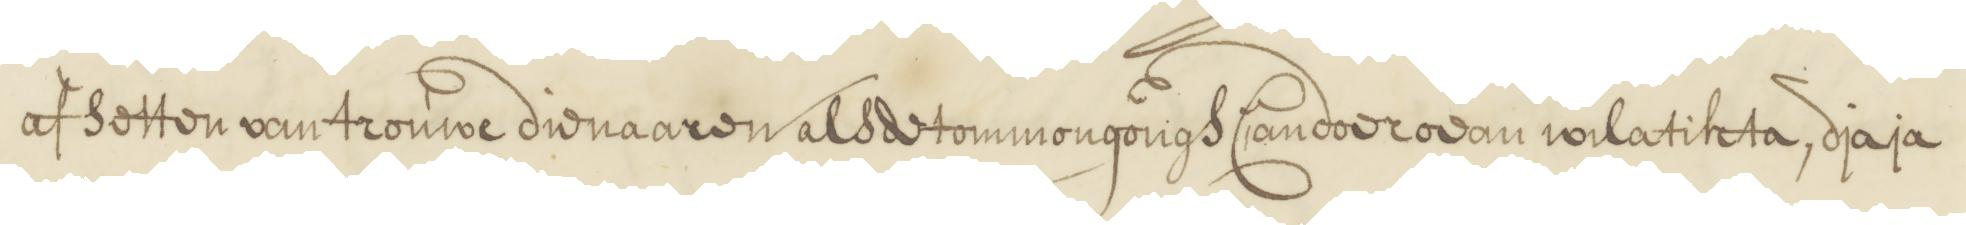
afsetten van trouwe dienaaren als de tommongongs Ciandoerovan wilatikta, djaja
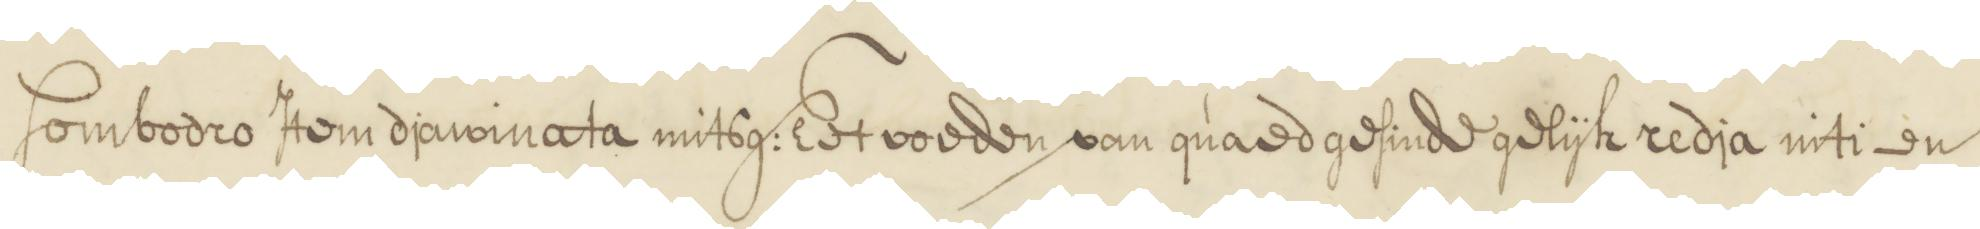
sombodro Item djawinata mitsg:s het voeden van quaed gesinde gelijk redja niti en
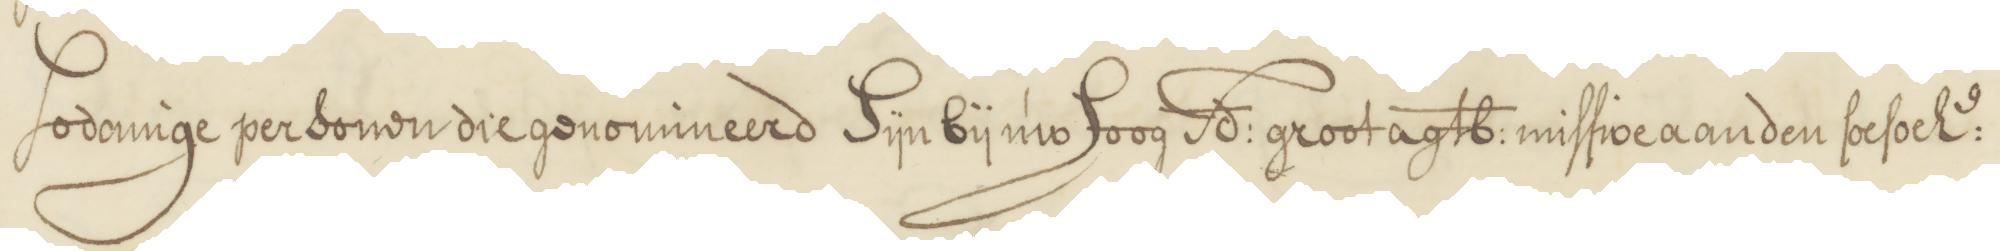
sodanige personen die genomineerd sijn bij uw hoog Ed: groot agtb: missive aan den soesoeh:g
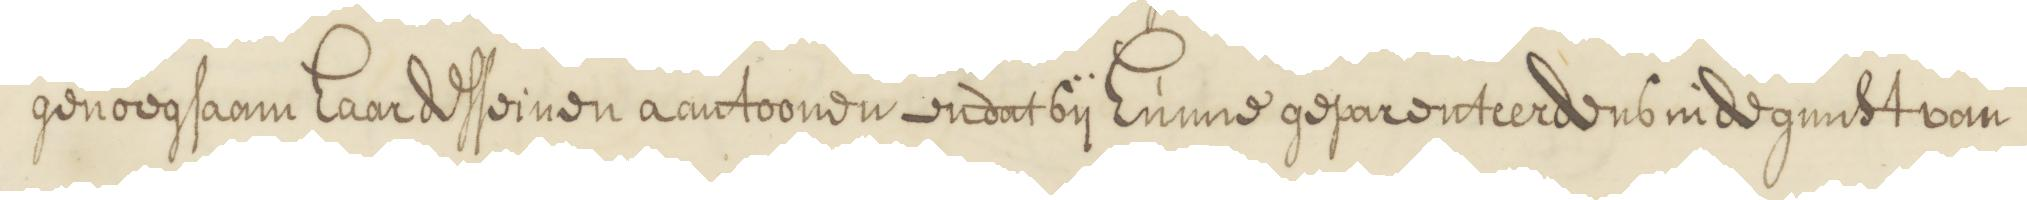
genoegsaam haar desseinen aantoonen en dat bij hunne geparenteerdens in de gunst van
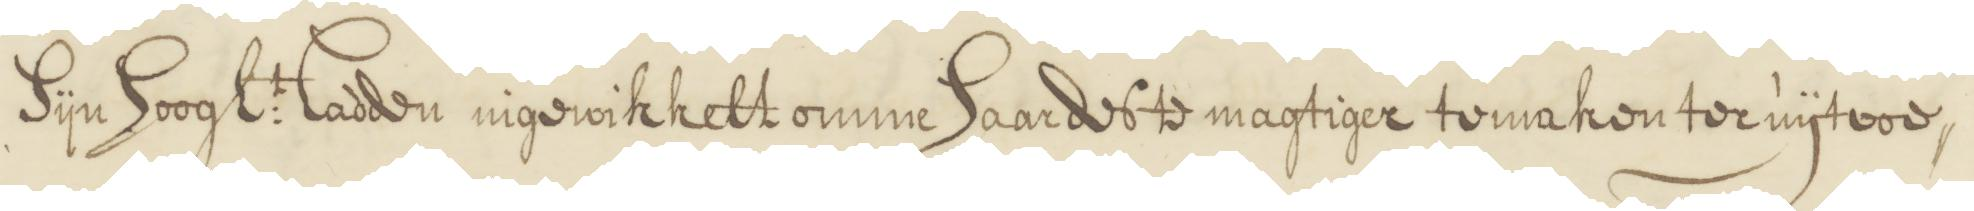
sijn hoogh:t hadden ingewikkelt omme haar des te magtiger temaken ter uijtvoe„
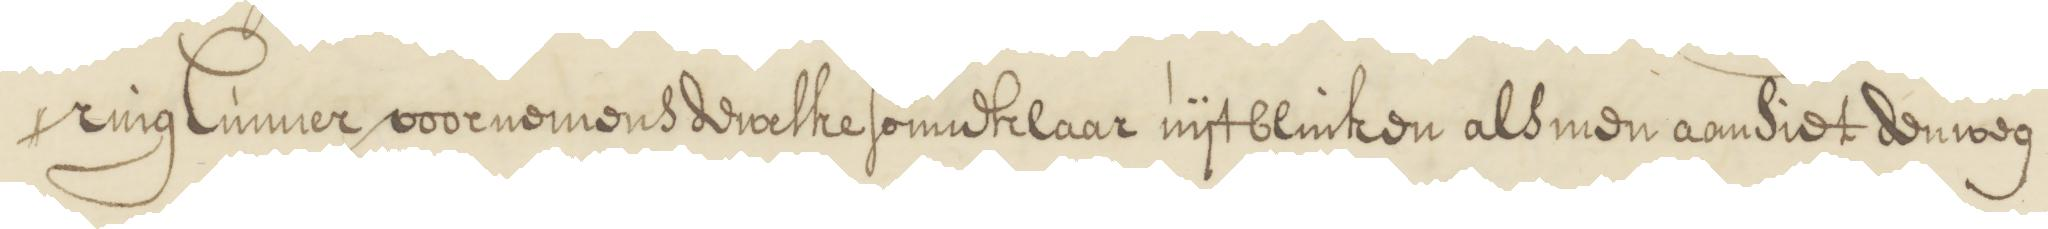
„ring hunner voornemens dewelke sonneklaar uijtblinken als men aansiet den weg
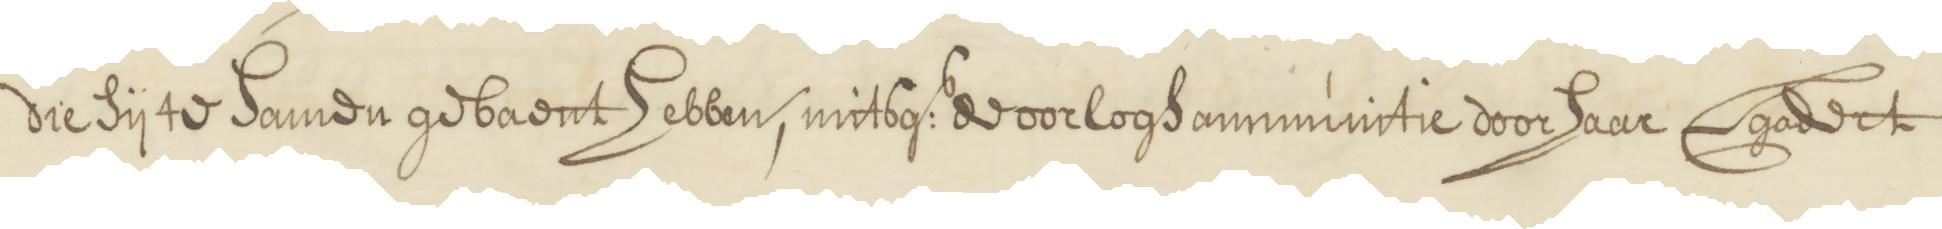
die sij te samen gebaent hebben, mitsg:s de oorlogsammunitie door haar vergadert
